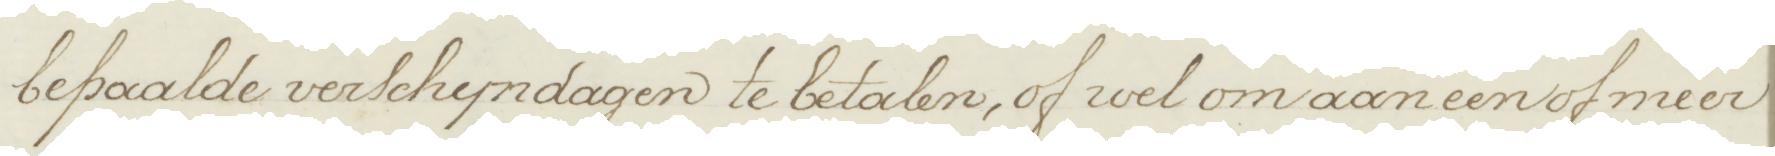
bepaalde verschyndagen te betalen, of wel om aan een of meer
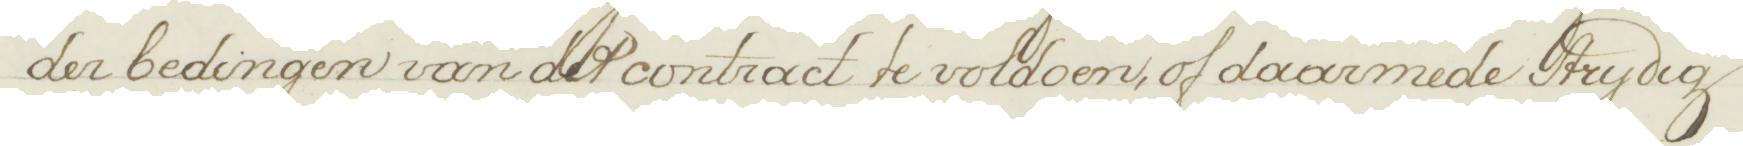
der bedingen van dit contract te voldoen, of daarmede strydig
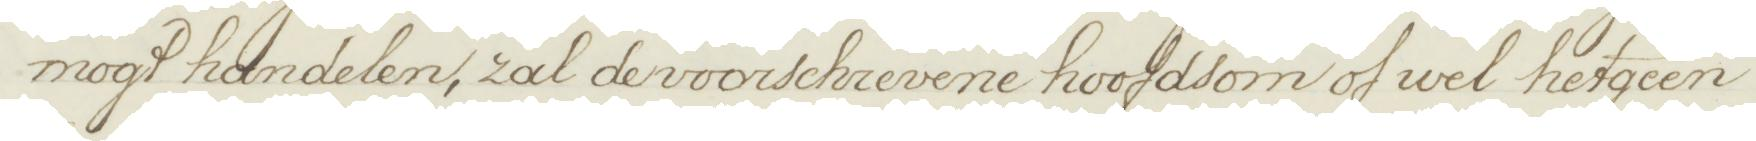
mogt handelen, zal de voorschrevene hoofdsom of wel hetgeen
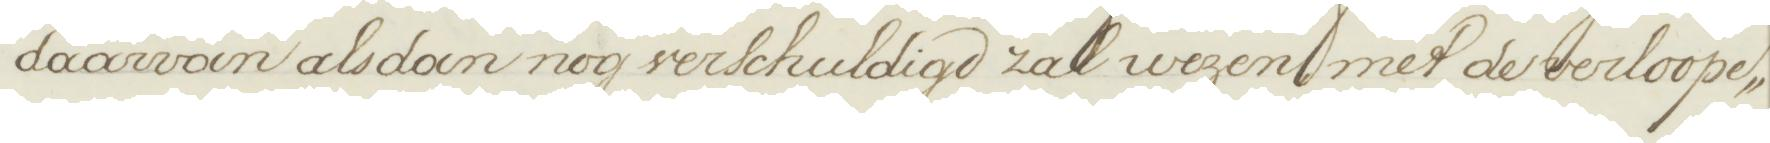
daarvan als dan nog verschuldigd zal wezen met de verloope„
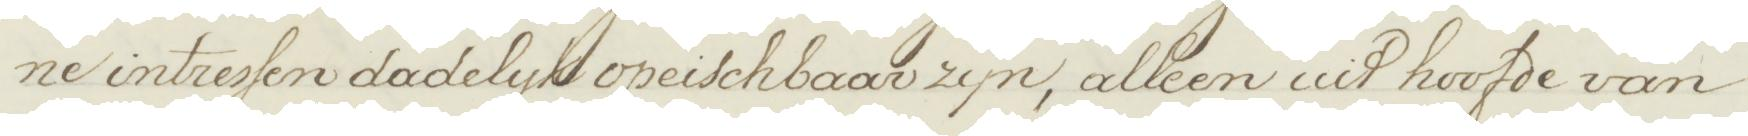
ne intressen dadelyk opeischbaar zyn, alleen uit hoofde van
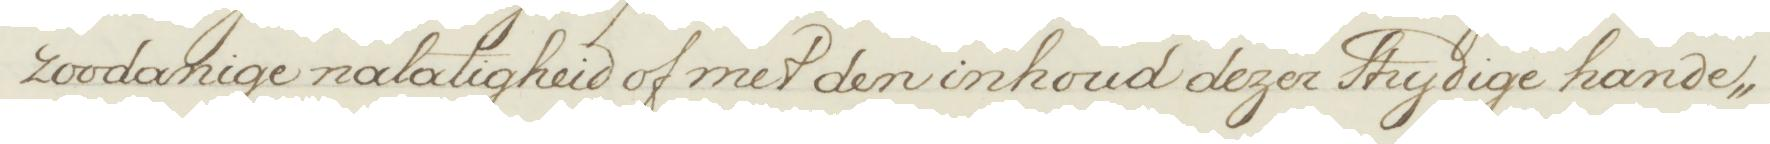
zoodanige nalatigheid of met den inhoud dezer strydige hande„
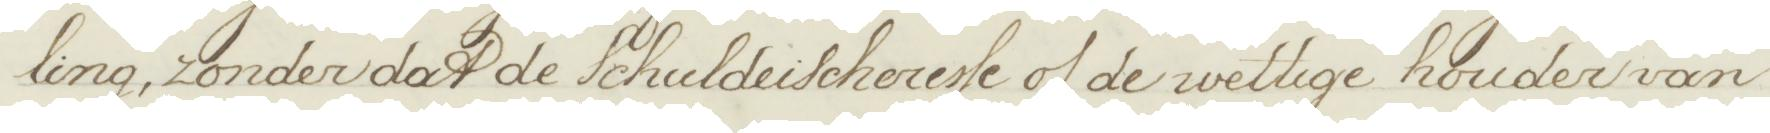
ling, zonder dat de schuldeischeresse of de wettige houder van
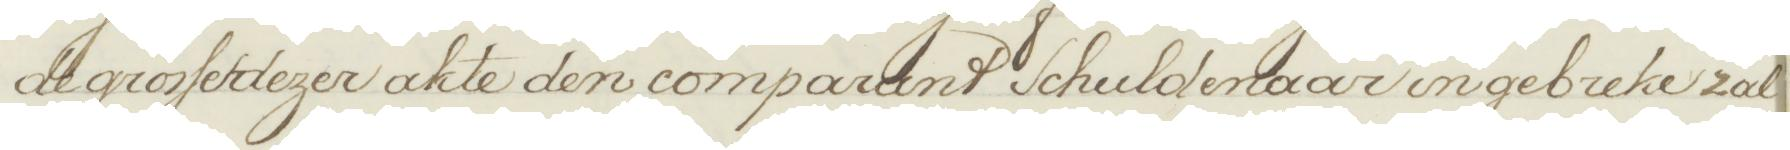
de grosse dezer akte den comparant schuldenaar in gebreke zal
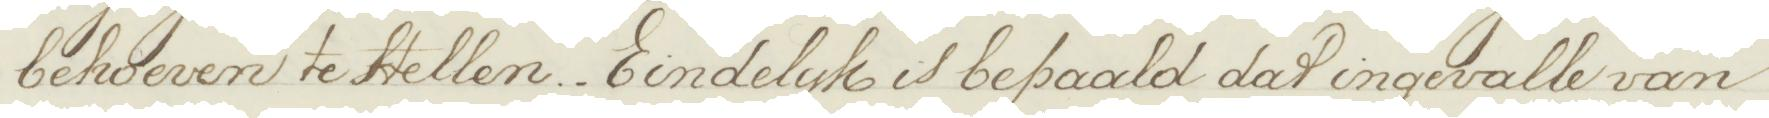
behoeven te stellen.- Eindelyk is bepaald dat ingevalle van
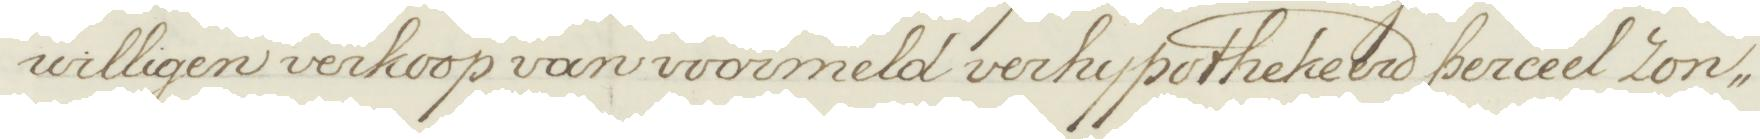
willigen verkoop van voormeld verhypothekeerd perceel zon„
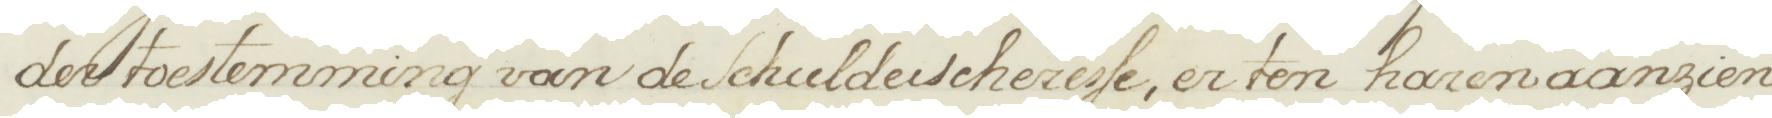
der toestemming van de Schulderscheresse, er ten haren aanzien
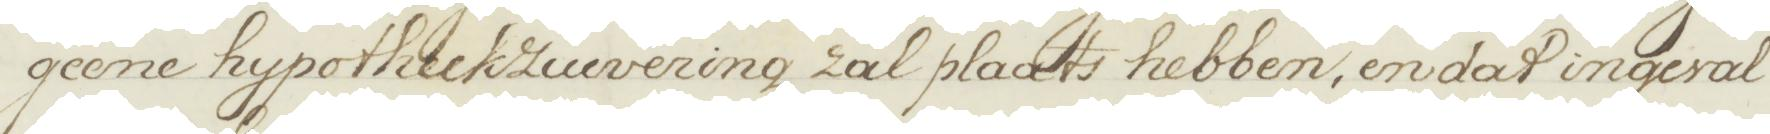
geene hypotheekzuivering zal plaats hebben, en dat ingeval
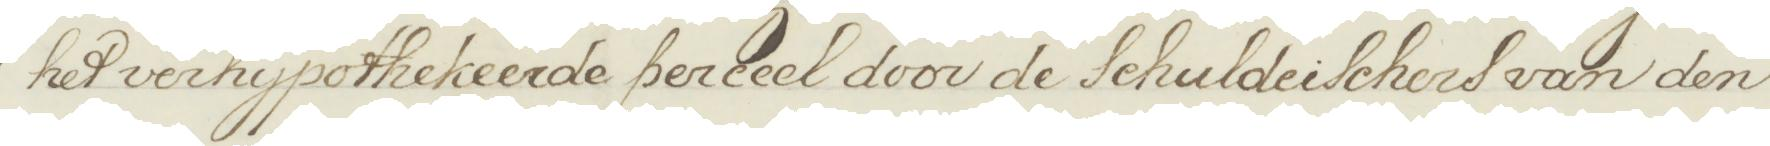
het verhypothekeerde perceel door de schuldeischers van den
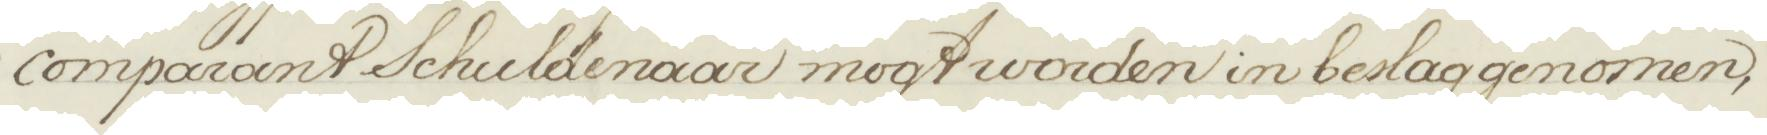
comparant schuldenaar mogt worden in beslag genomen,
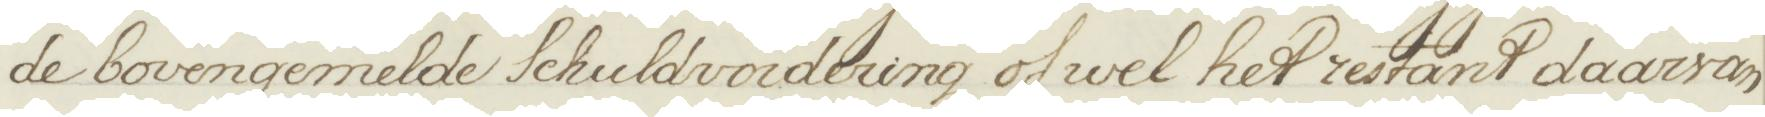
de bovengemelde schuldvordering of wel het restant daarvan
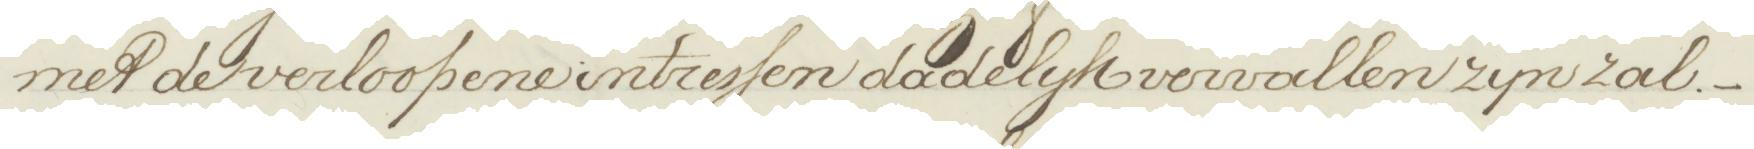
met de verloopene intressen dadelyk vervallen zyn zal.-
